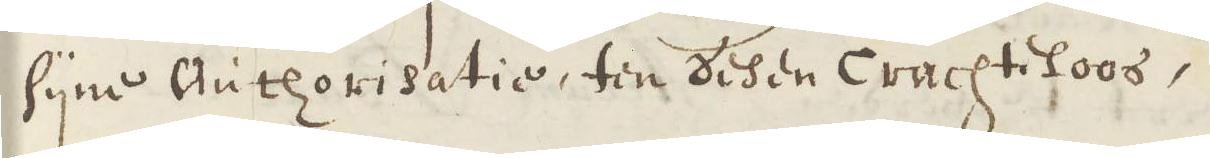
sijne authorisatie, ten desen Crachteloos,
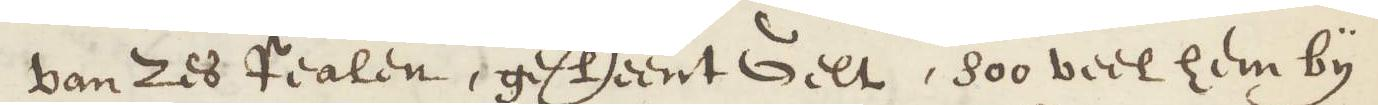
van zes Realen, geleent Gelt, soo veel hem bij
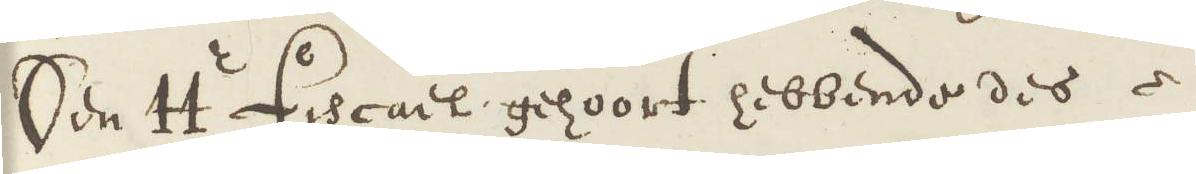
Den 44r fiscael gehoort hebbende des
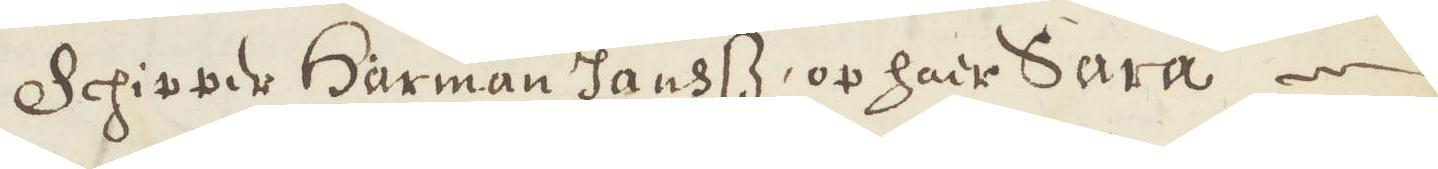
Schipper Harman Janssz, op haer Sara
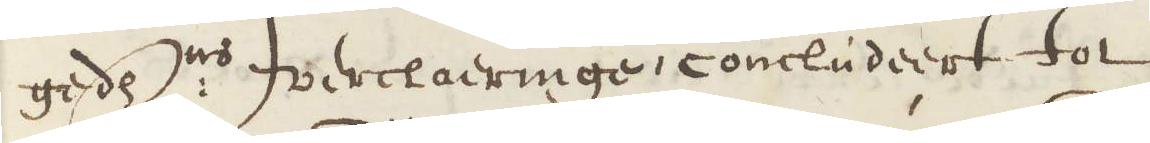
gedh:ns verclaeringe, concludeert tot
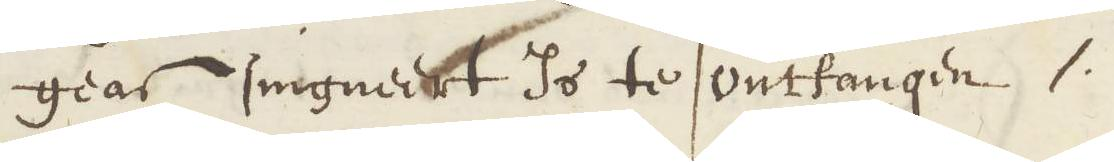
geassingneert Is te ontfangen /.
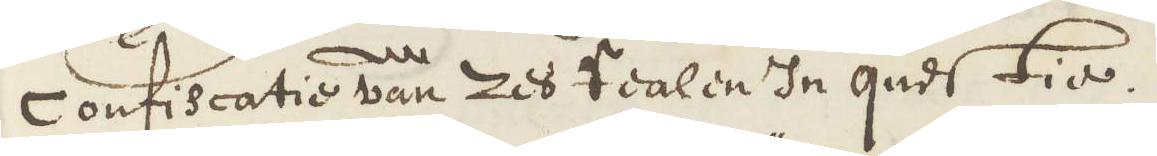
confiscatie van zes Realen In questie.
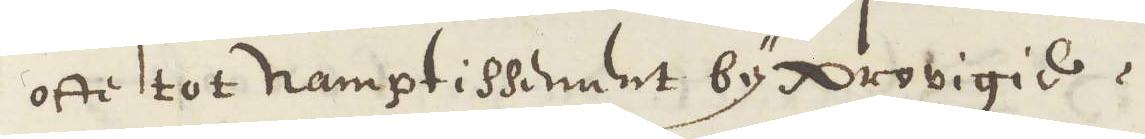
ofte tot namptissement bij provigie
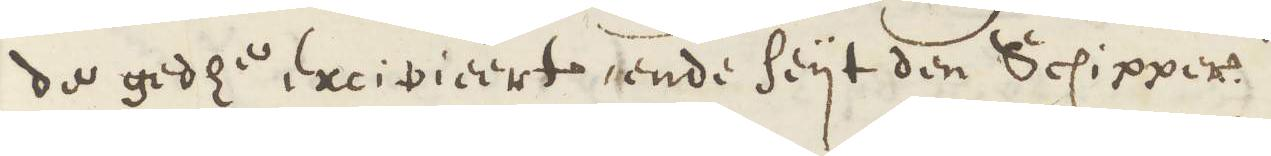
de gedhe excipieert ende seijt den schipper.
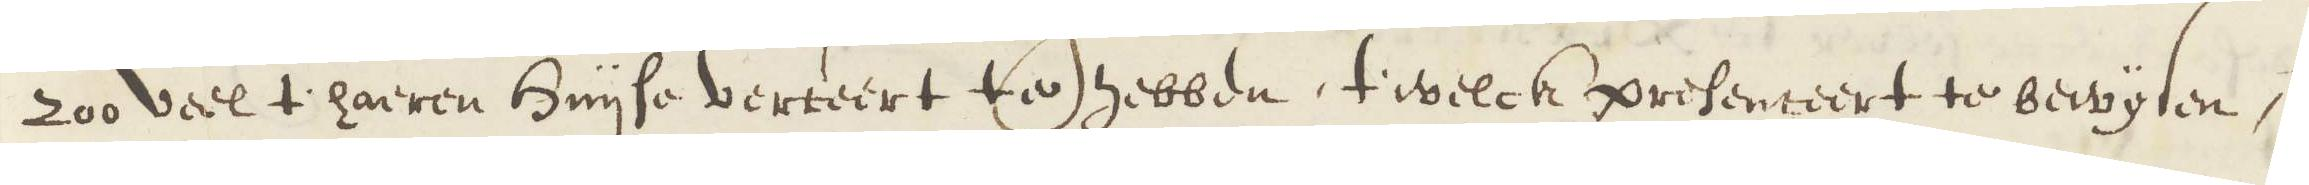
zoo veel t' haeren huijse verteert te hebben, t' welck presenteert te bewijsen,
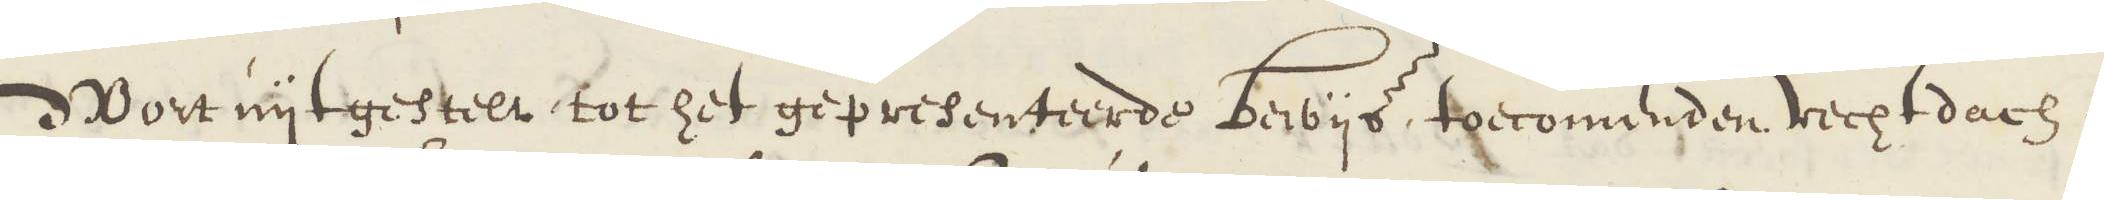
Wort uijtgestelt tot het gepresenteerde bewijs, toecomenden recht dach.
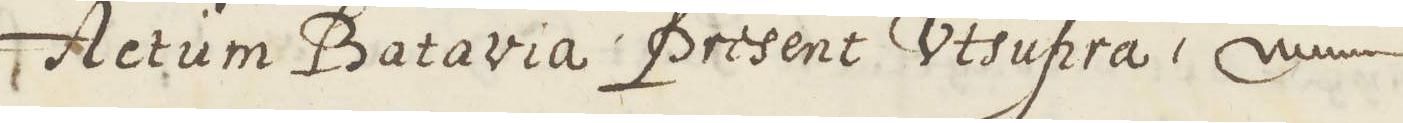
Actum Batavia Present Vtsupra /
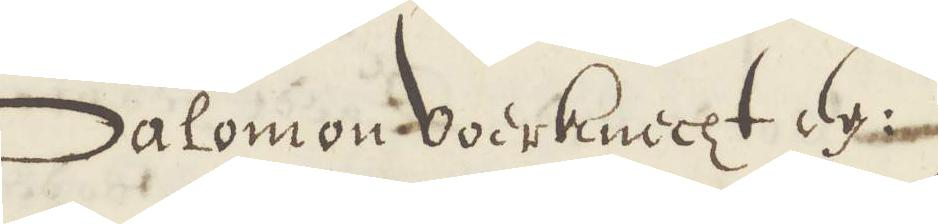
Salomon voerknecht ey:r
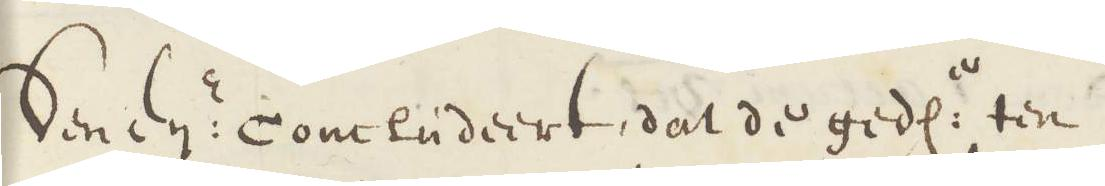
Den Ey:r concludeert, dat de gedh:e ten
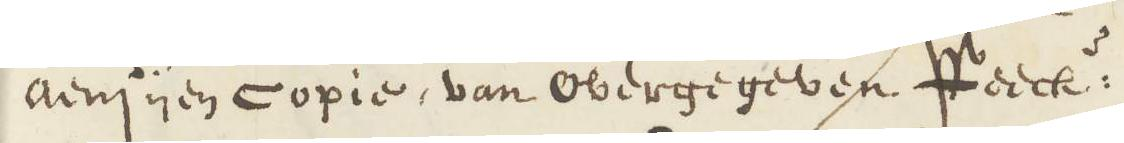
aensijen copie, van overgegeven Reeck:e
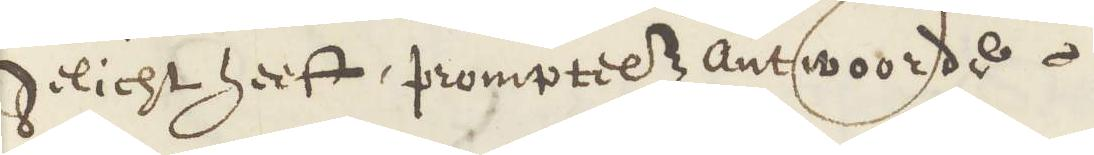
gelicht heeft, promptelijk antwoorde –
